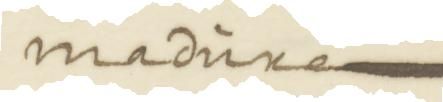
madura
